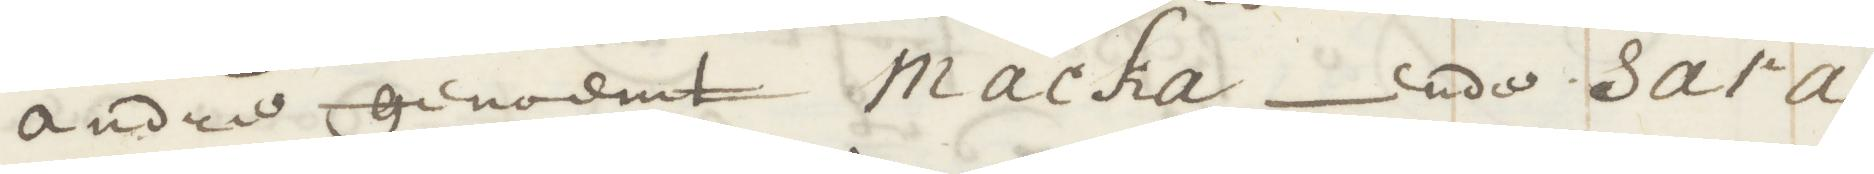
andre genoemt Macka ende Sara
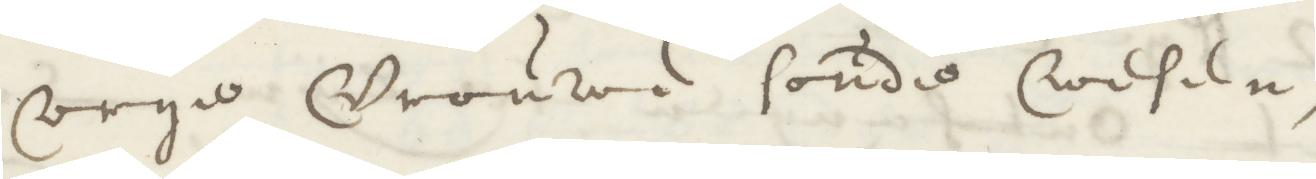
vrije Vrouwe soude wesen
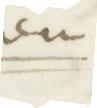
=en
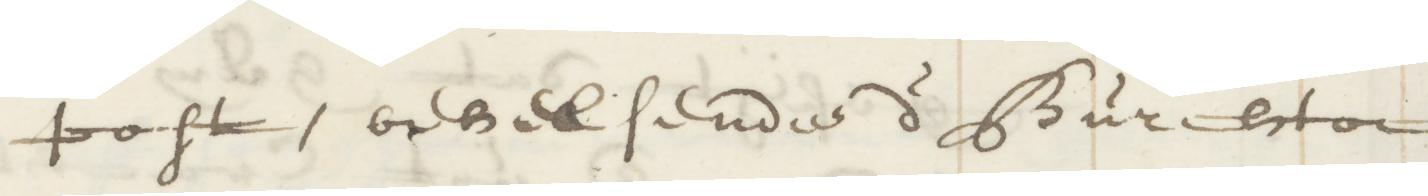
post, behelsende d' Burchtoc
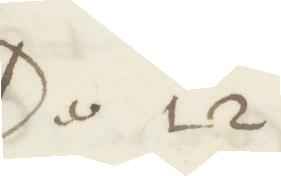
De 12
